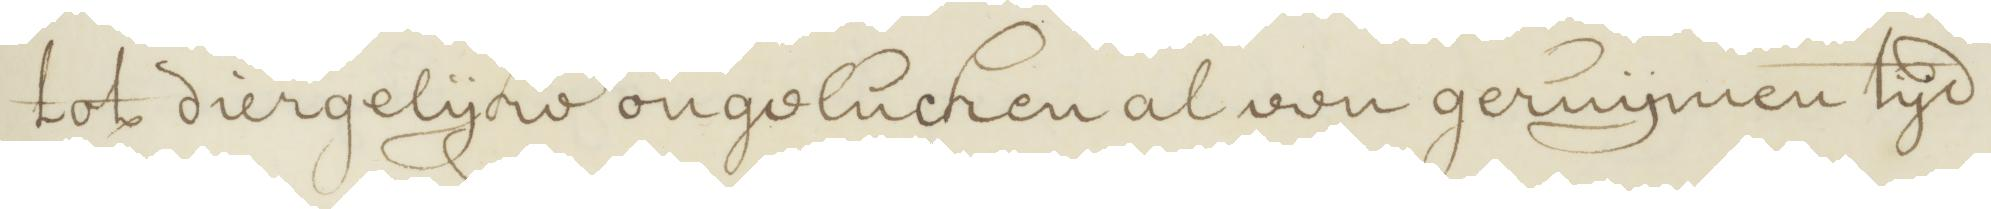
tot diergelijke ongelucken al een geruijmen tijd
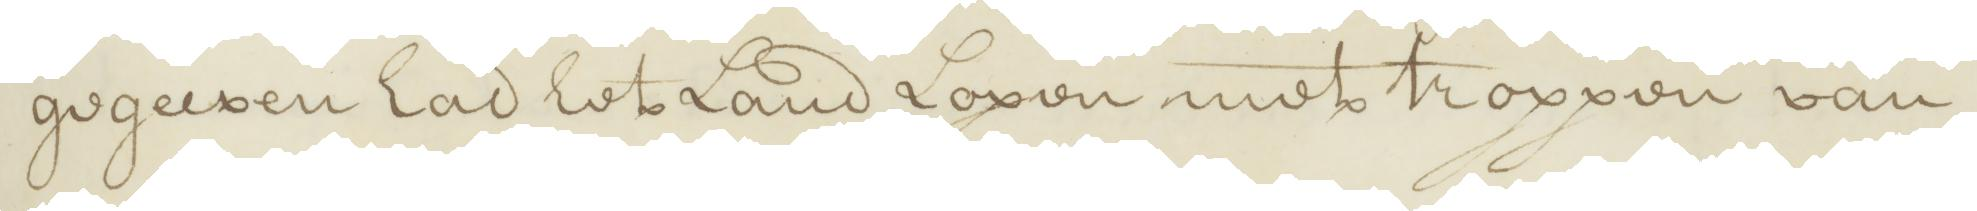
gegeeven had het Land Lopen met troppen van
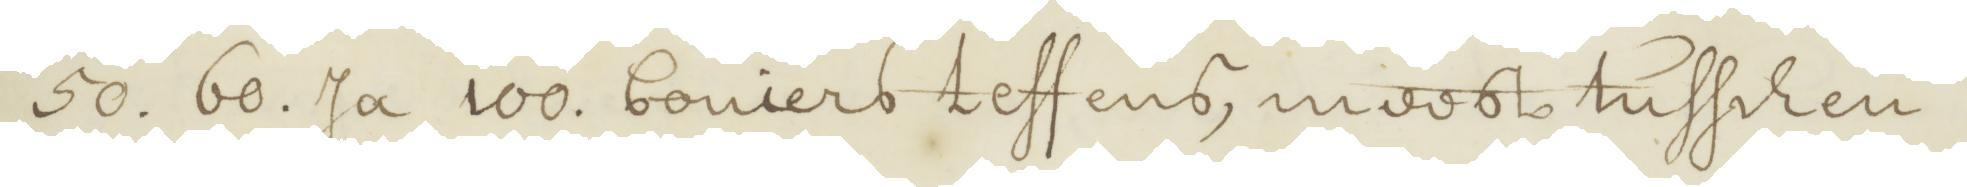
50. 60. Ja 100. boniers teffens, meest tusschen
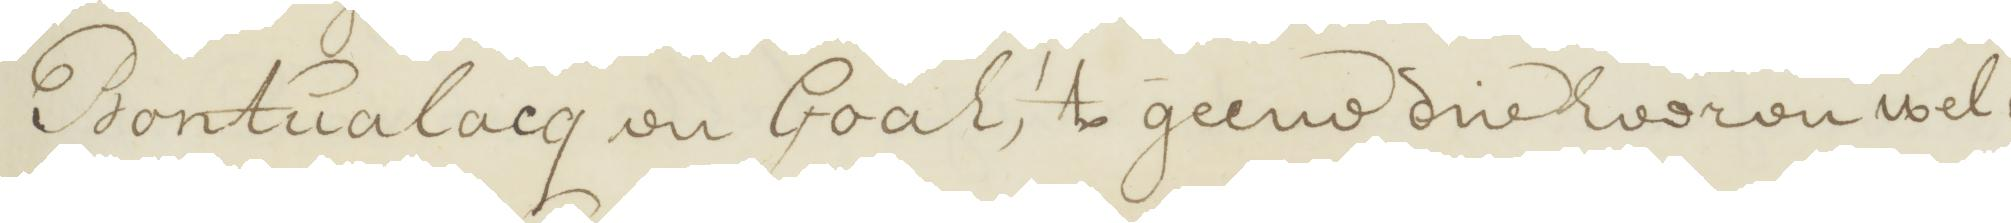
Bontualacq en Goah, ’t geene die heeren wel
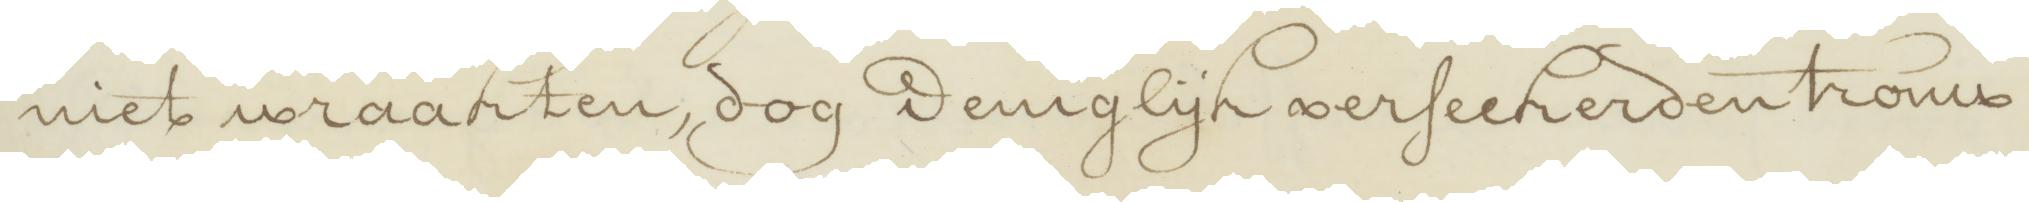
niet wraakten, dog Eeniglijk verseekerden trouw
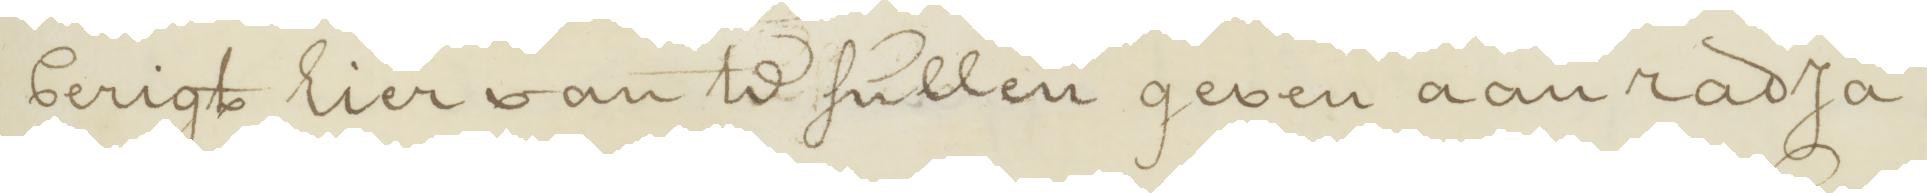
berigt hier van te sullen geven aan radja
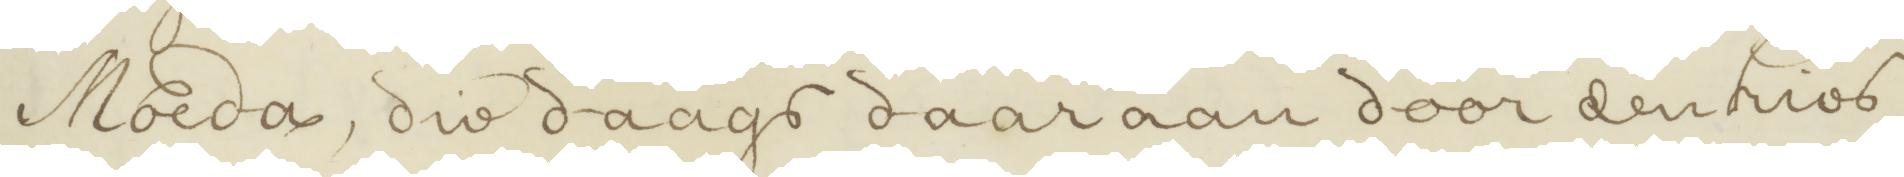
Moeda, die daags daar aan door den kies
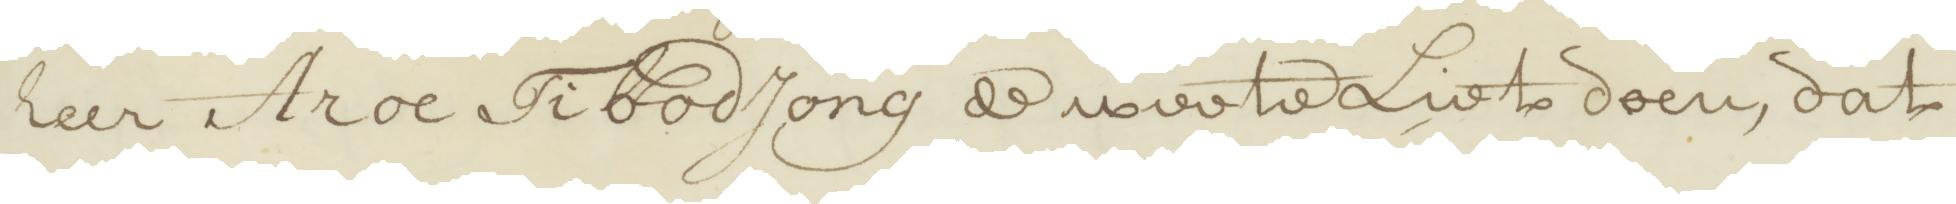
heer Aroe Tibodjong de weete Liet doen, dat
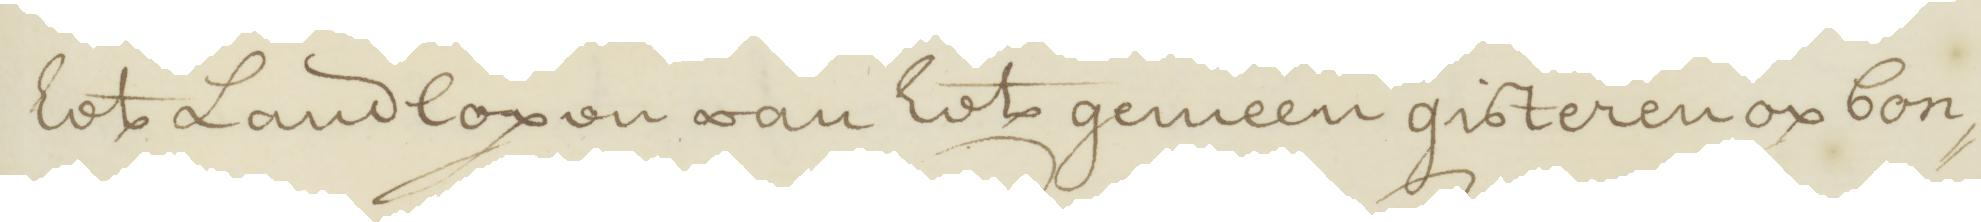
het Landlopen van het gemeen gisteren op bon„
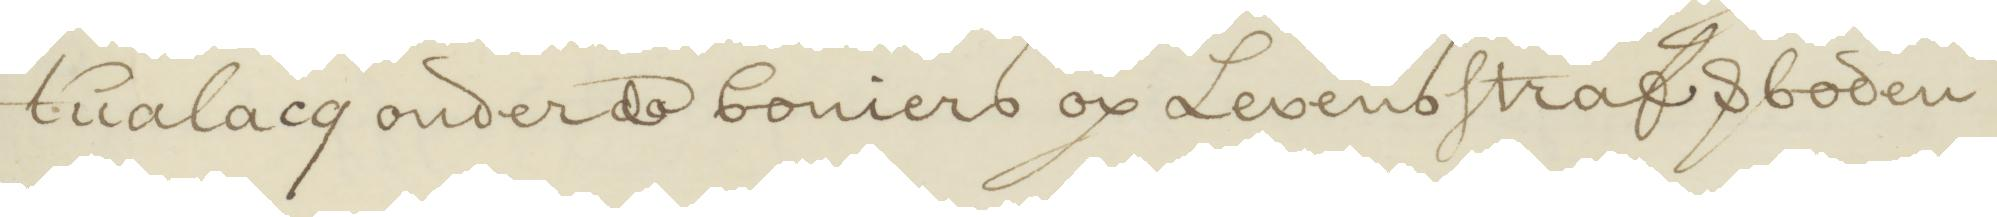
tualacq onder de boniers op Levensstraf verboden
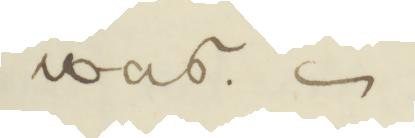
was.—
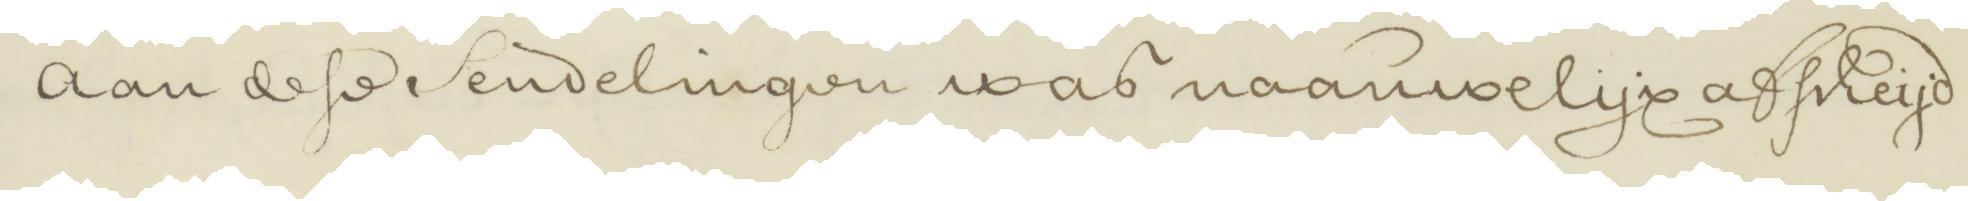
aan dese sendelingen was naauwelijx afscheijd
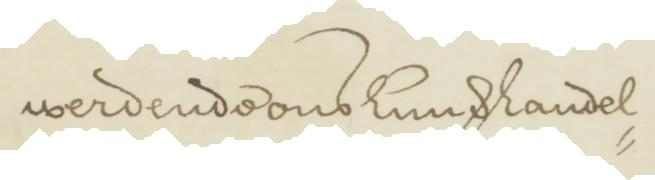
werdende ons hun verhandel„
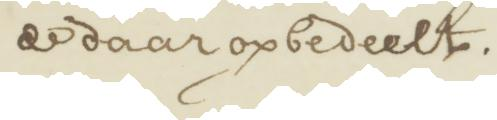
de daar opbedeelt.
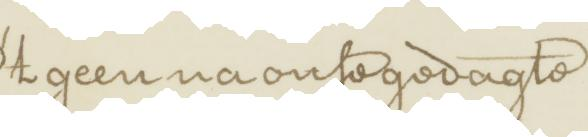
’t geen na onse gedagte
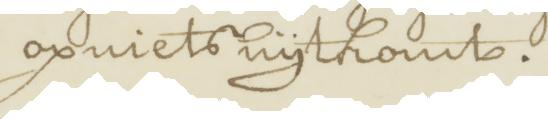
op niets uijtkomt.
